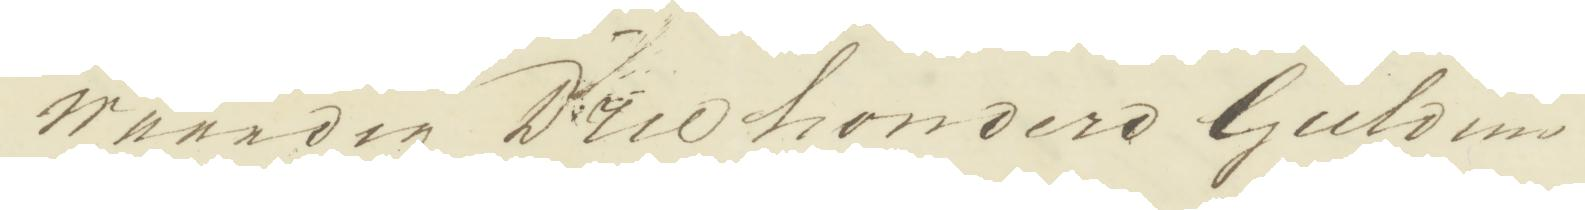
waardig Drie honderd Guldens
